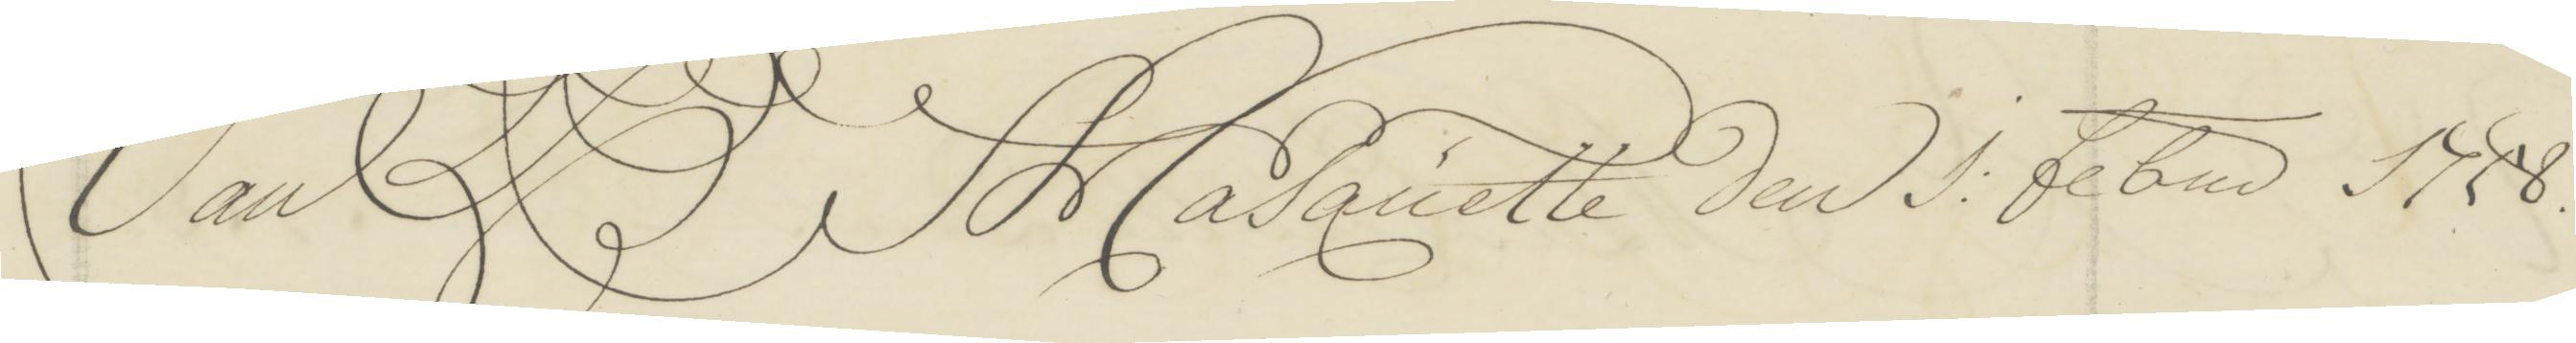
Van Masquette den 1: febr 1758.
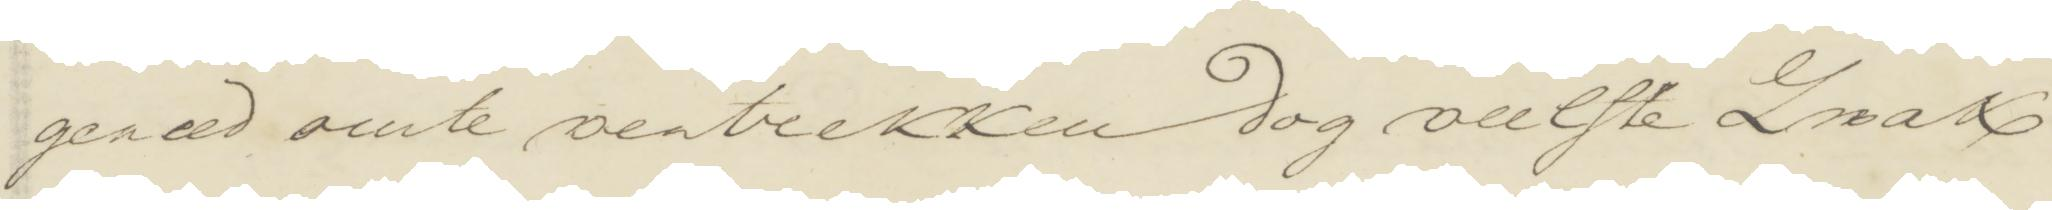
gereed omte vertrekken dog veelste zwak
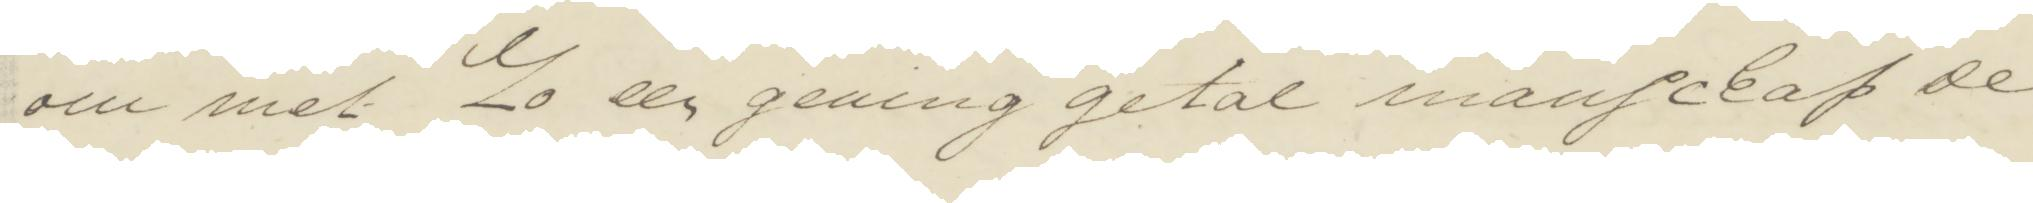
om met zo een gering getal manschap de
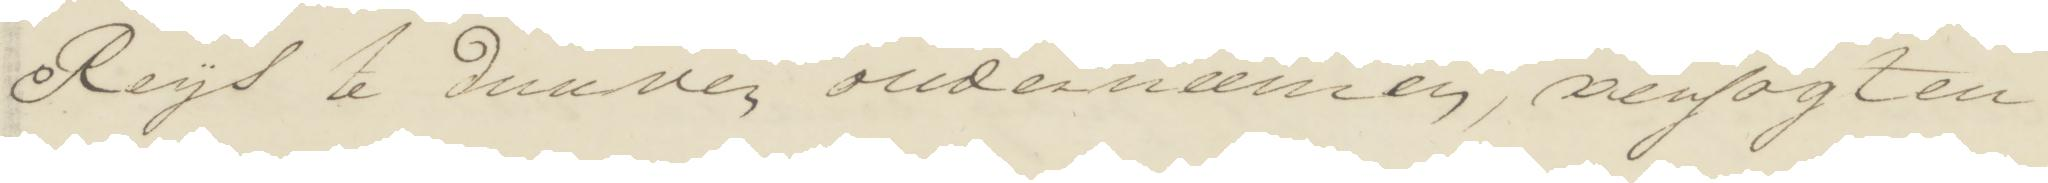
Reijs te durven onderneemen, versogten
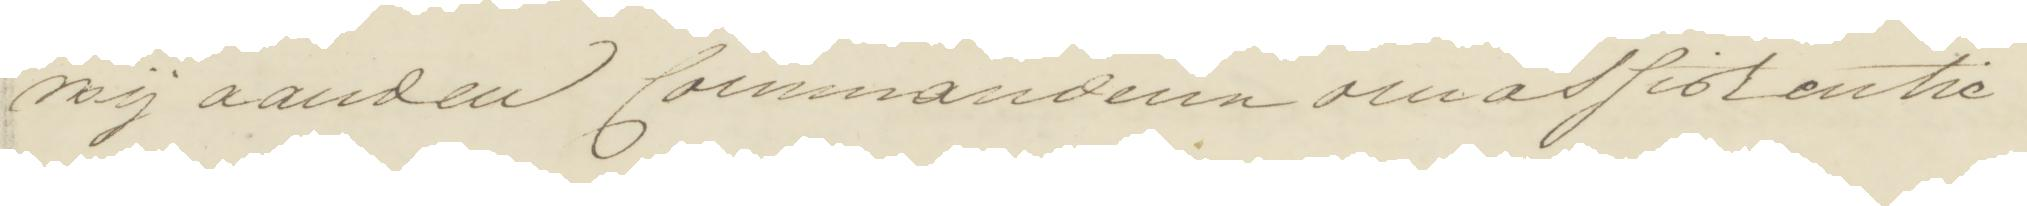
wij aanden Commandeur om assistentie
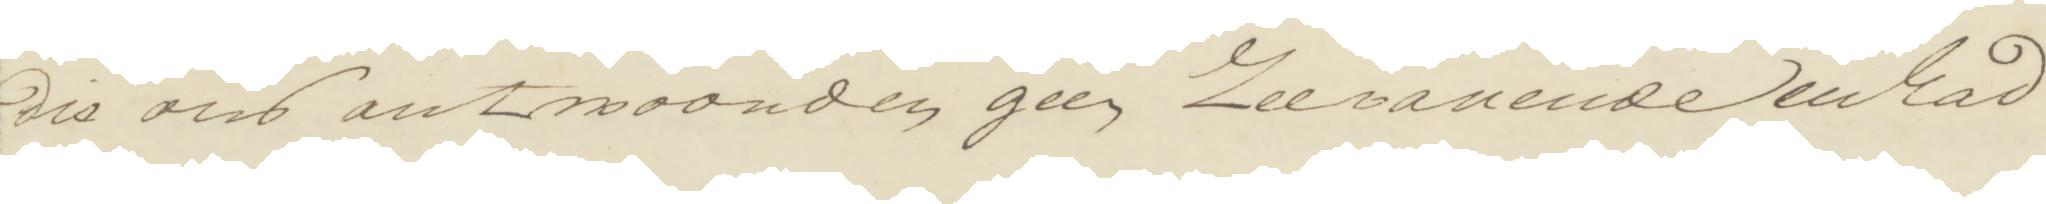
die ons antwoorden geen zeevarende en had
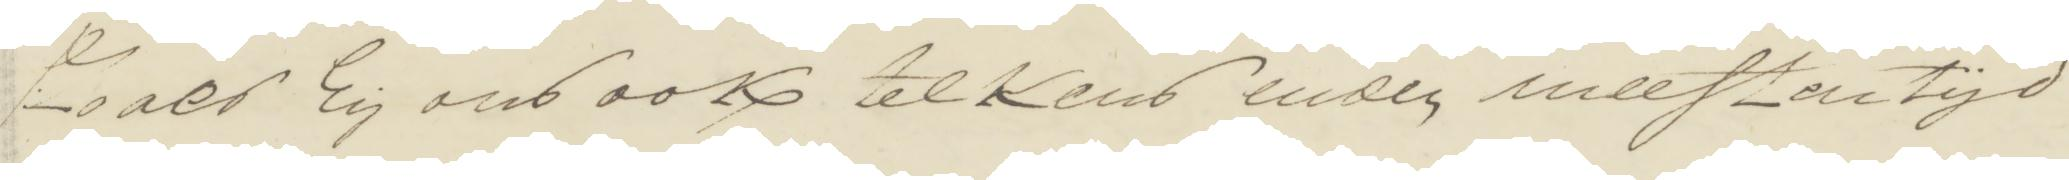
zoals hij ons ook telkens enden meesten tijd
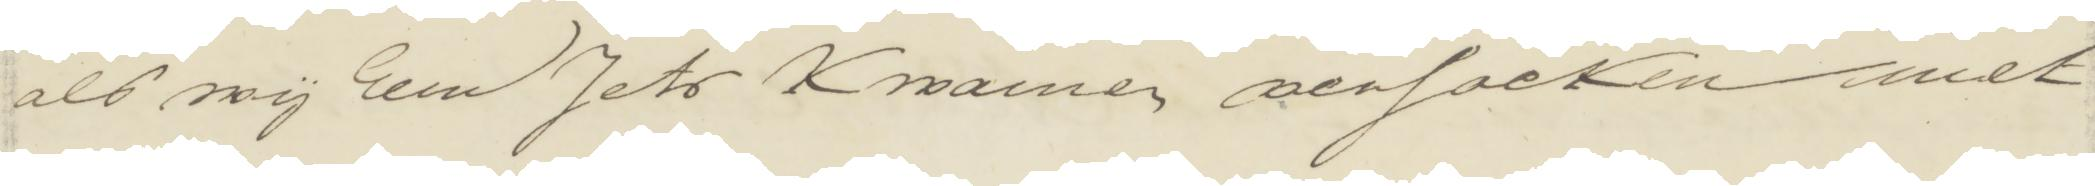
als wij hem Jets kwamen versoeken met
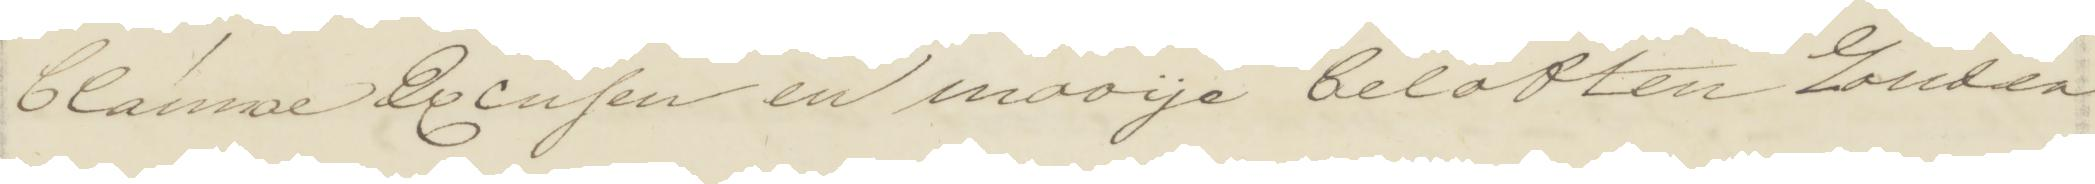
blauwe Excusen en mooije beloften zonder
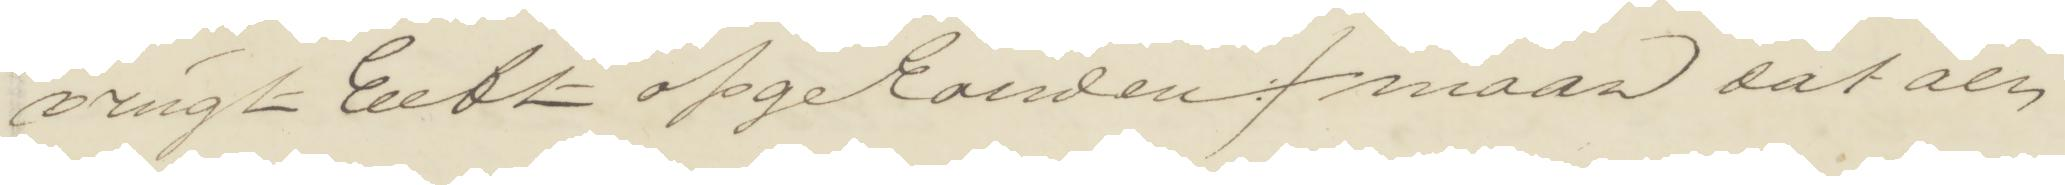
vrugt heeft opgehouden :/ maar dat aen
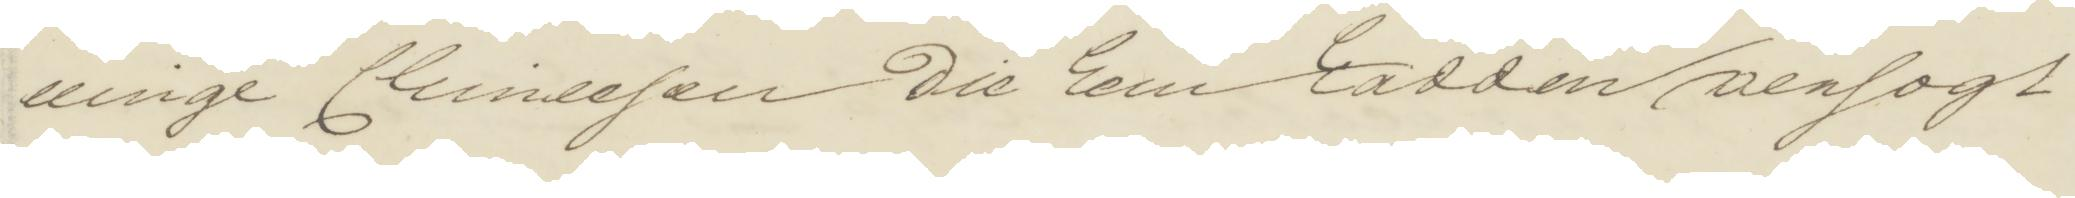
eenige Chineesen die hem hadden versogt
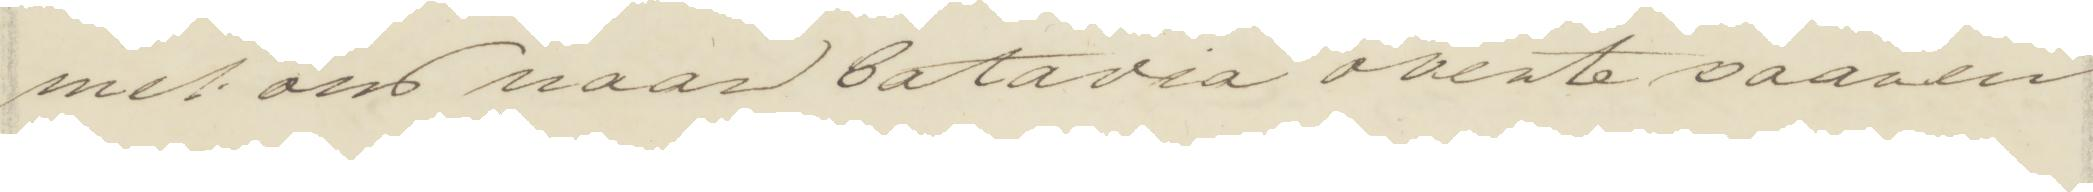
met om naar batavia overte vaaren
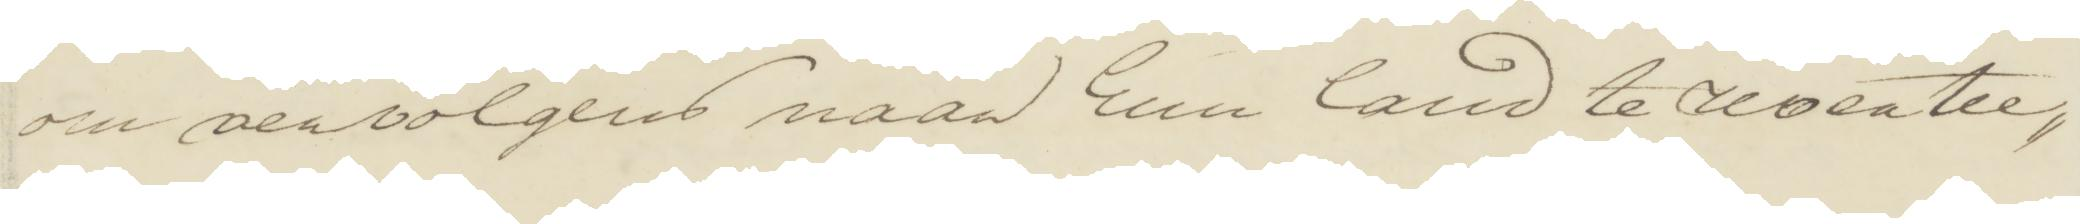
om vervolgens naar hun land te revertee„
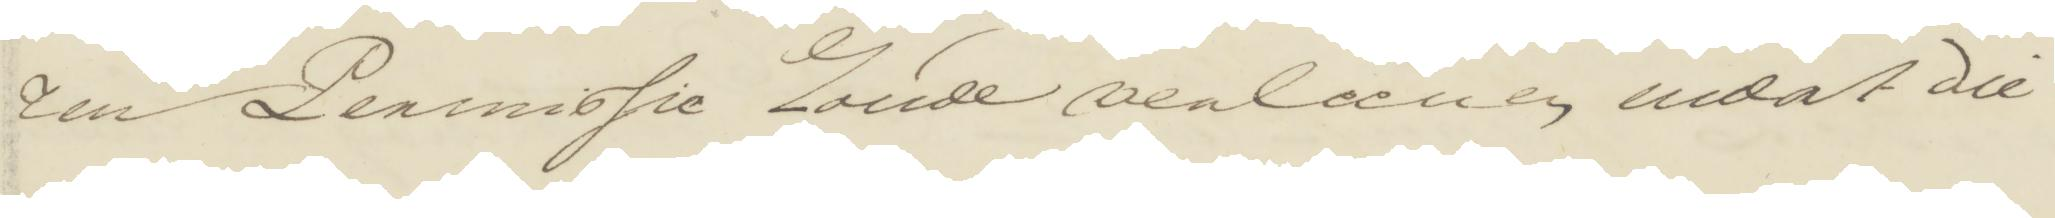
ren Permissie zoude verleenen endat die
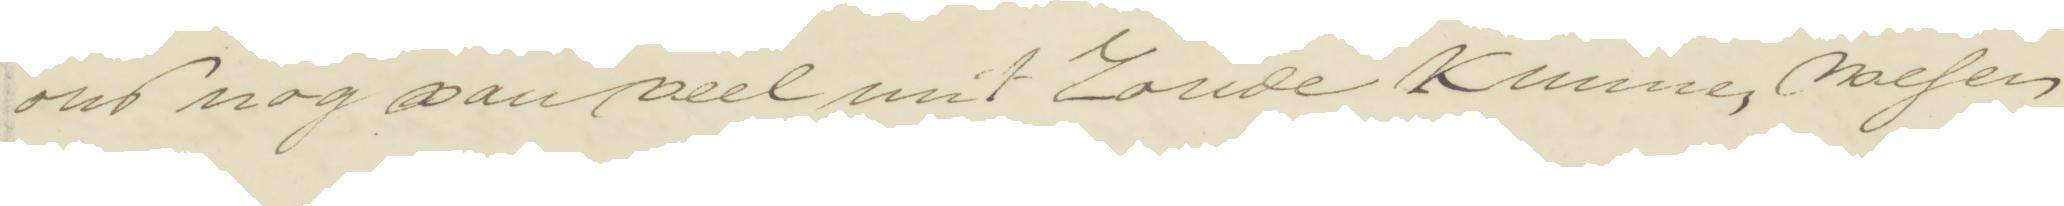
ons nog van veel nut zoude kunnen wesen
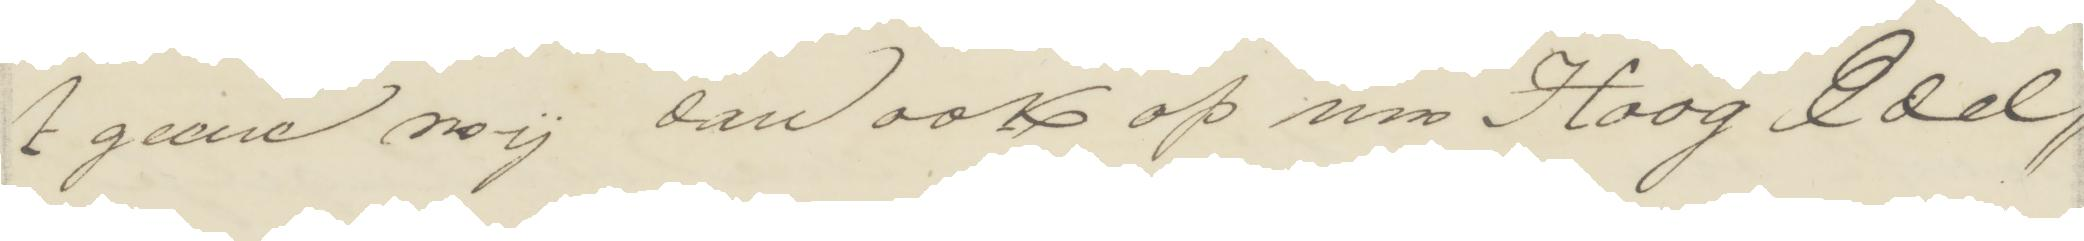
t geene wij dan ook op uw Hoog Edel„
